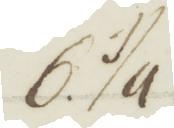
6 1/4
